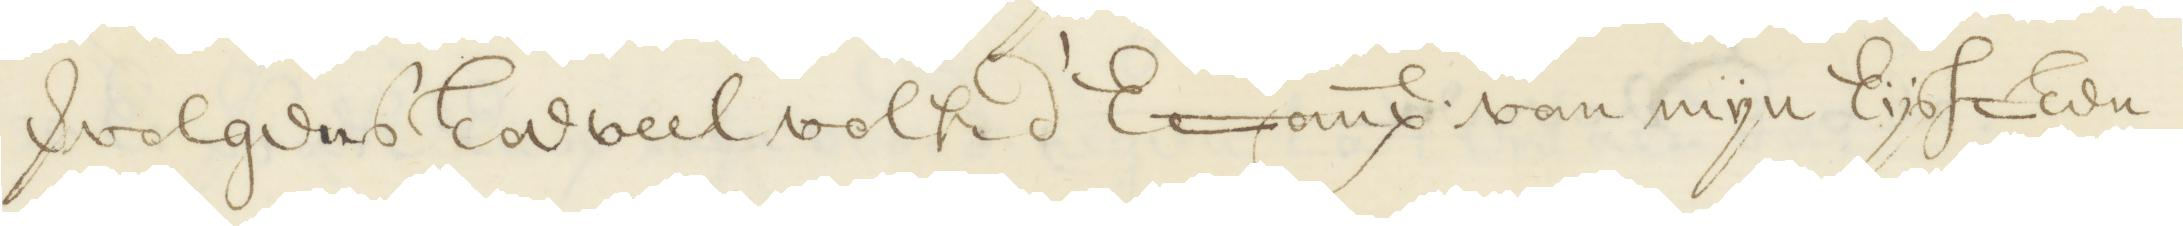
vervolgens hoe veel volk d’Ecomp: van mijn Eijsschen
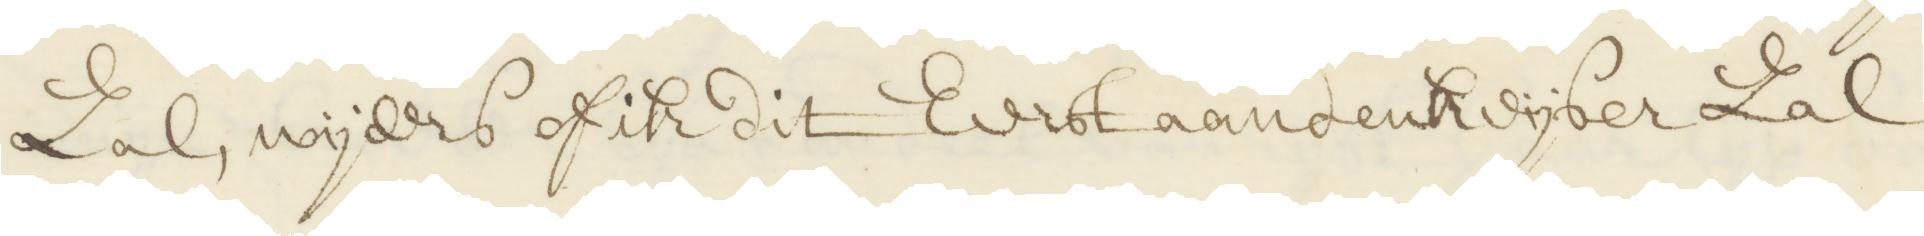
zal, wijders of ik dit Eerst aan den keijser zal
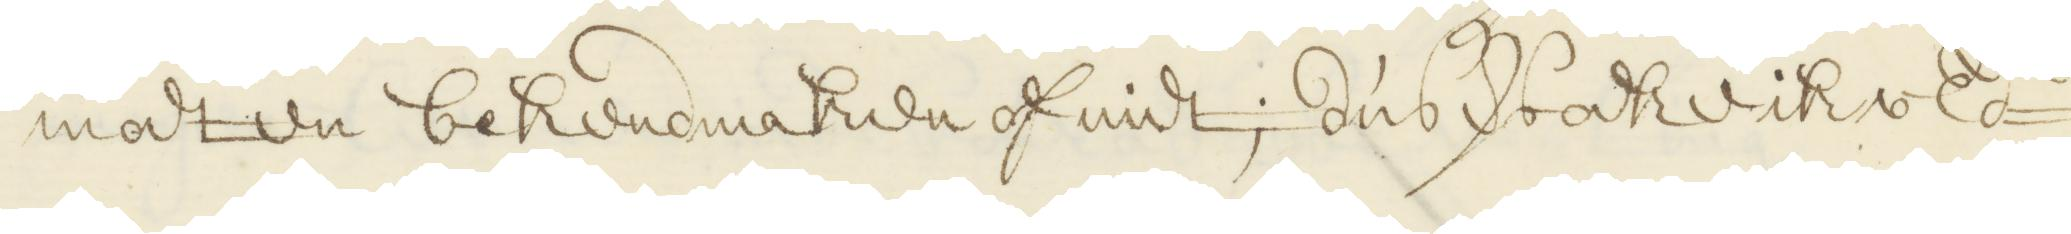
moeten bekendmaken of niet; dus versoeke ik vEd=le
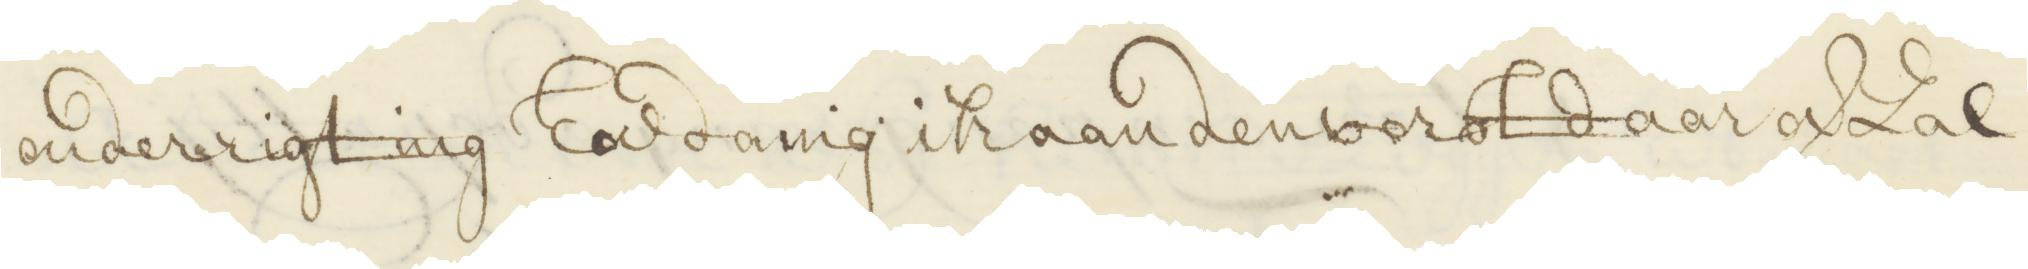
onderrigting hoedanig ik aan den vorst daar over zal
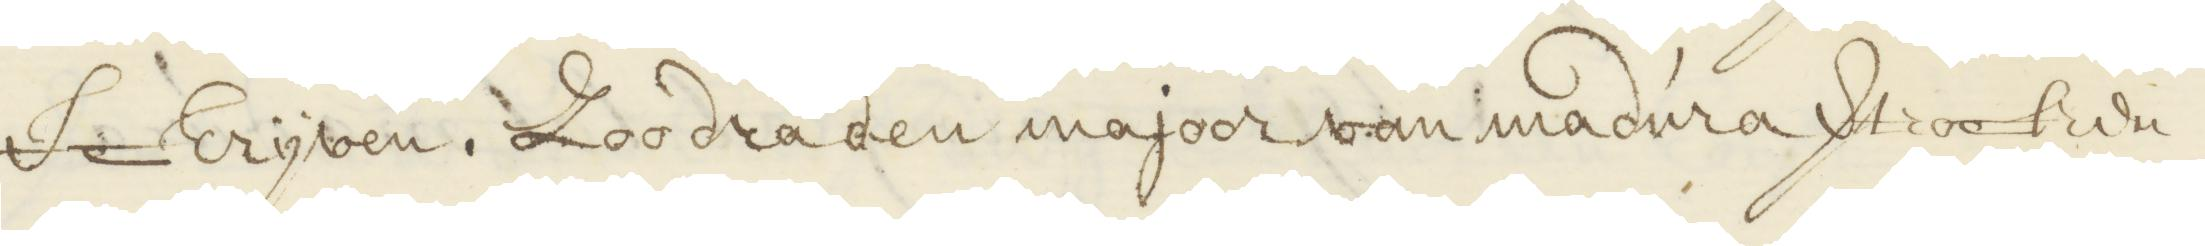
schrijven. zoo dra den majoor van madura vertrocken
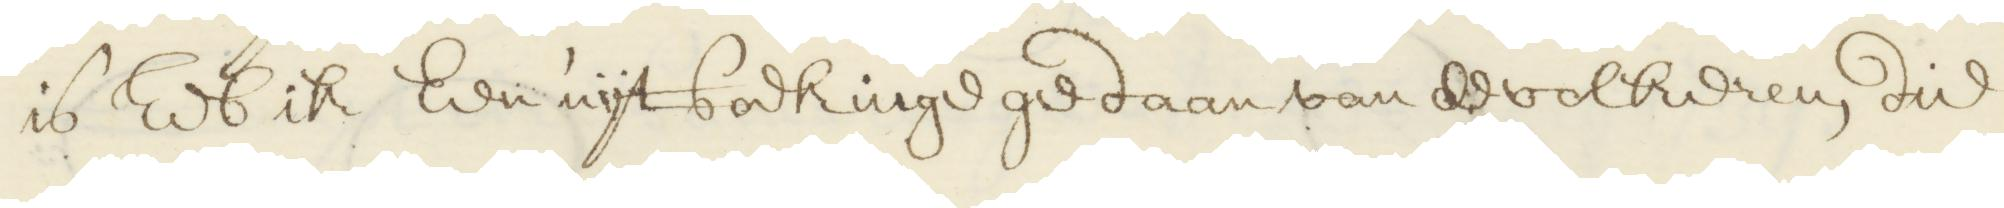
is heb ik Een uijtsoekinge gedaan van de volkeren die
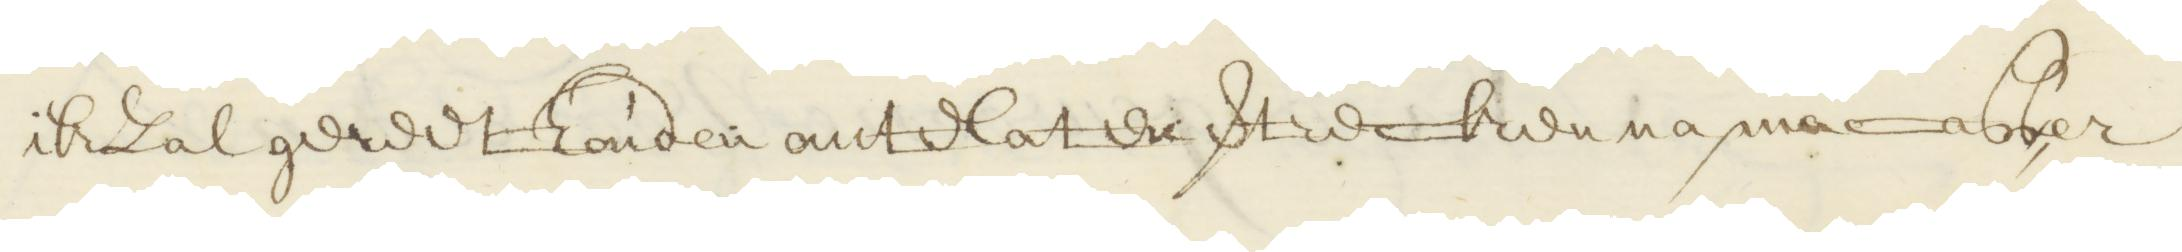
ik zal gereet houden omtelaten vertrecken na macasser,
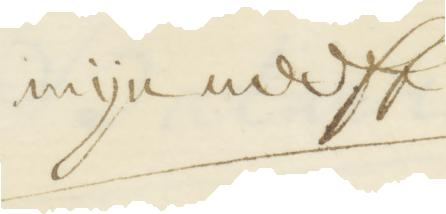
mijn neeff
